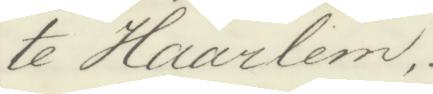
te Haarlem,
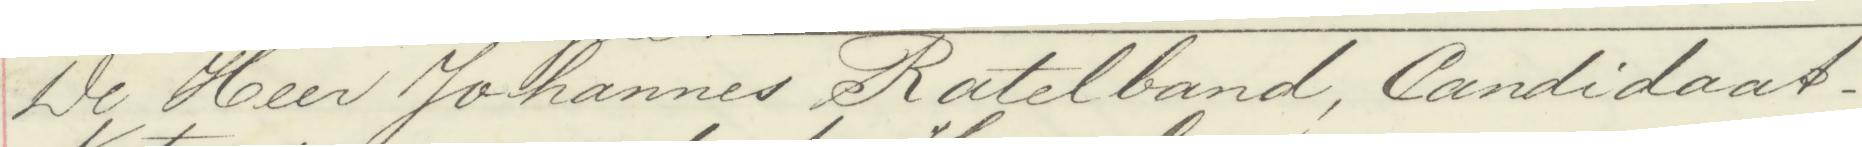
De Heer Johannes Ratelband, Candidaat-
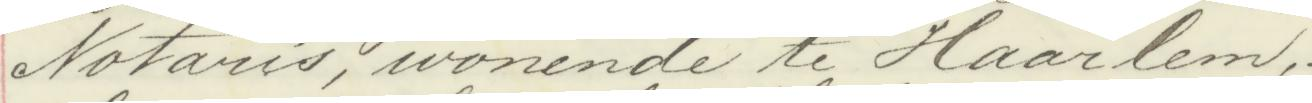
Notaris, wonende te Haarlem,
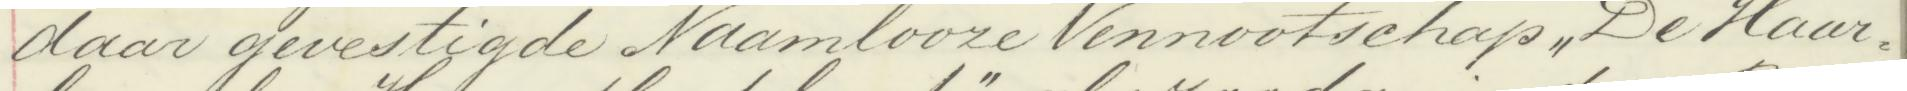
daar gevestigde Naamlooze Vennootschap „ De Haar=
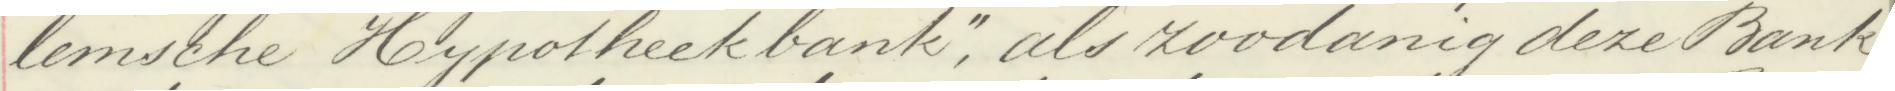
lemsche Hypotheekbank", als zoodanig deze Bank
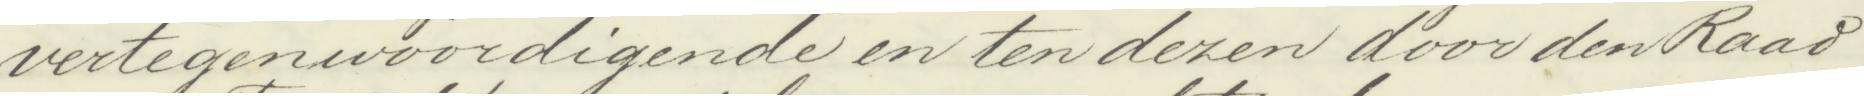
vertegenwoordigende en ten dezen door den Raad
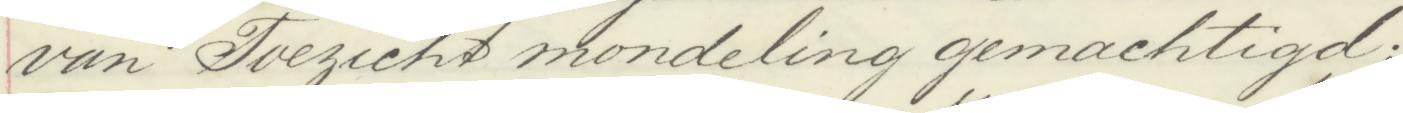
van Toezicht mondeling gemachtigd;
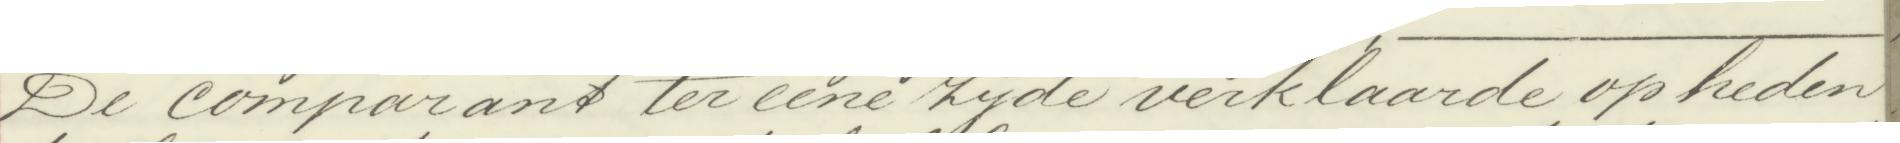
De comparant ter eene zijde verklaarde op heden
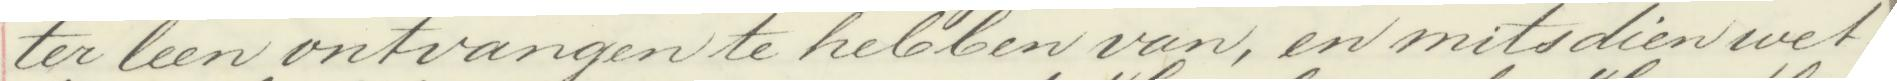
ter leen ontvangen te hebben van, en mitsdien wet=
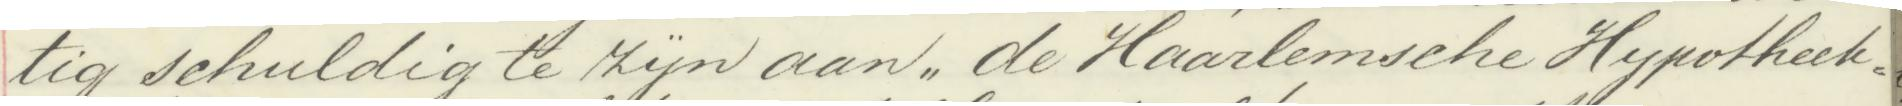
tig schuldig te zijn aan „ de Haarlemsche Hypotheek=
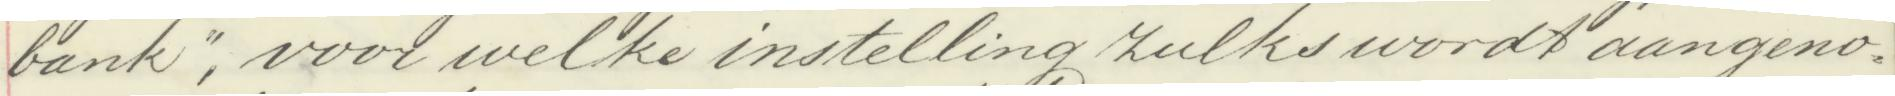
bank", voor welke instelling zulks wordt aangeno=
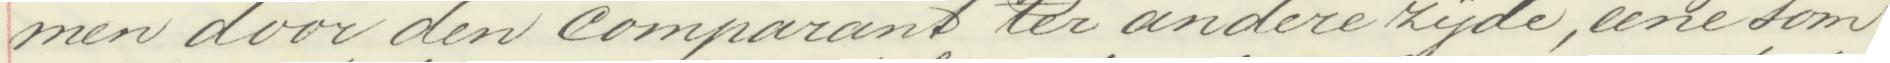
men door den comparant ter andere zijde, eene som
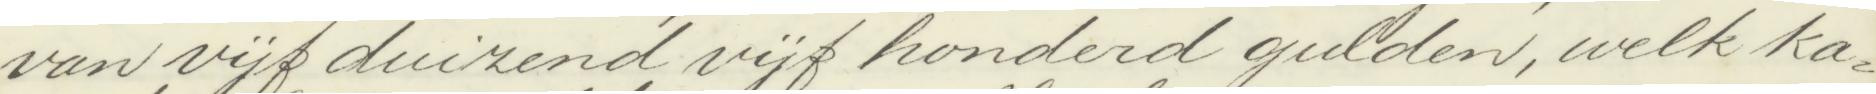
van vijf duizend vijf honderd gulden, welk ka=
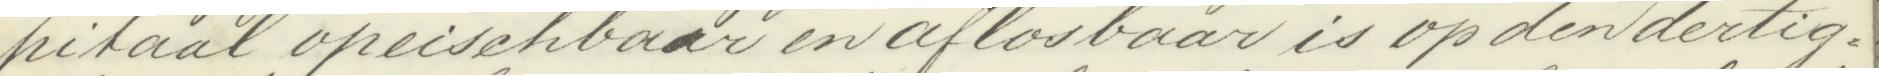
pitaal opeischbaar en aflosbaar is op den dertig=
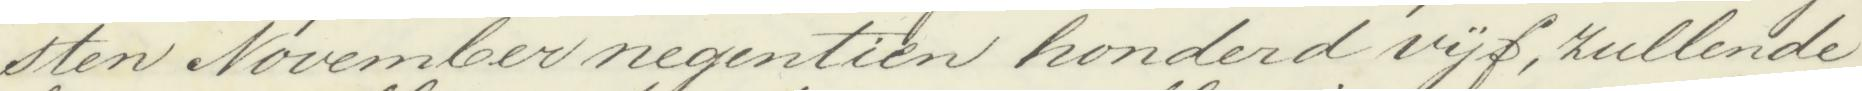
sten November negentien honderd vijf, zullende
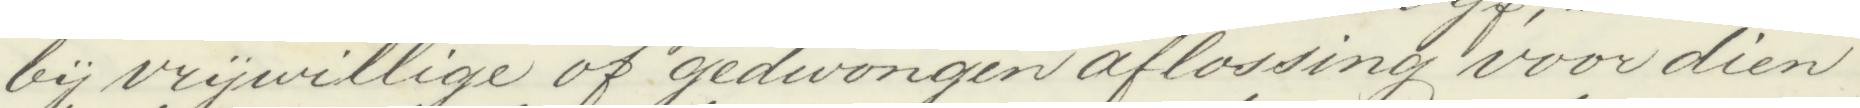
bij vrijwillige of gedwongen aflossing voor dien
